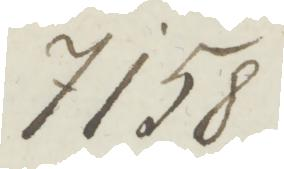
No 7158.
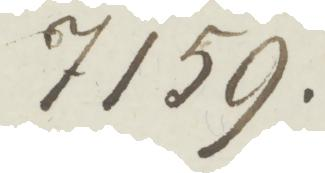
7159.
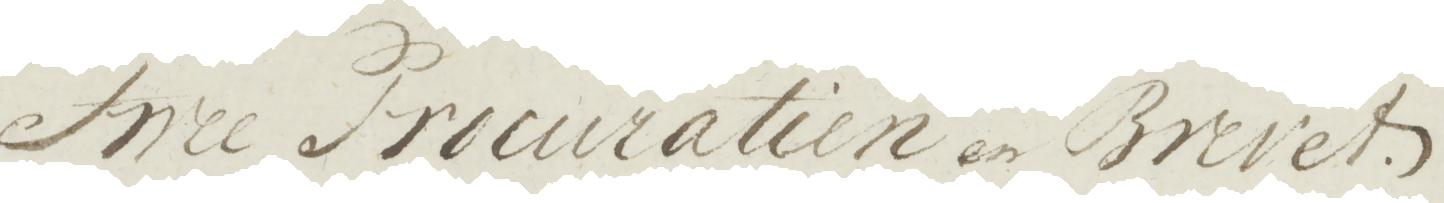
Twee Procuratien en Brevêt.
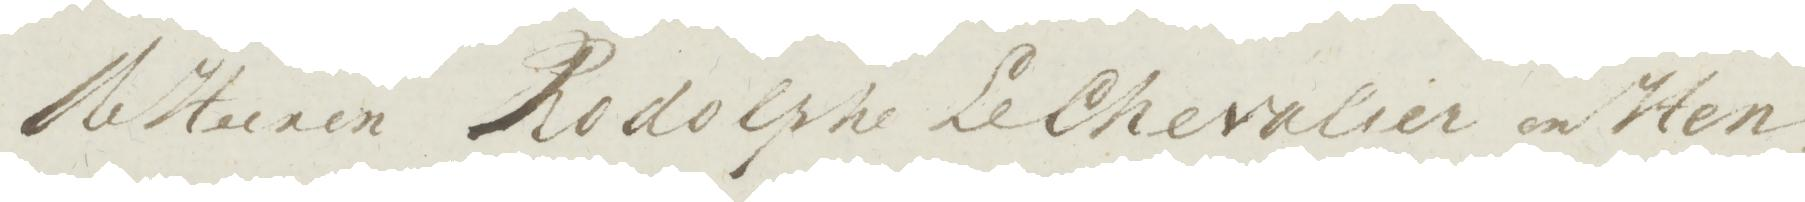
de Heeren Rodolphe Le Chevalier en Hen
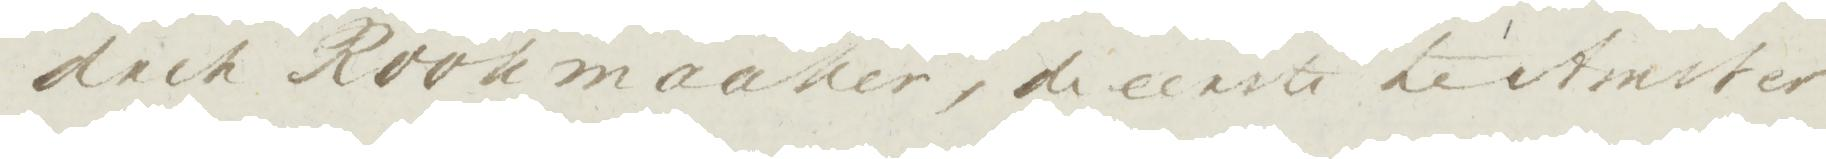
drik Rookmaaker, de eerste te Amster
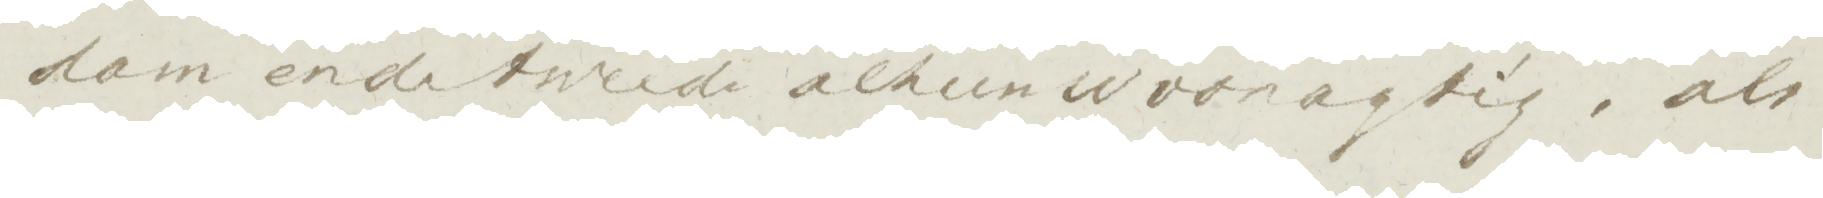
dam en de tweede alhier woonagtig, als
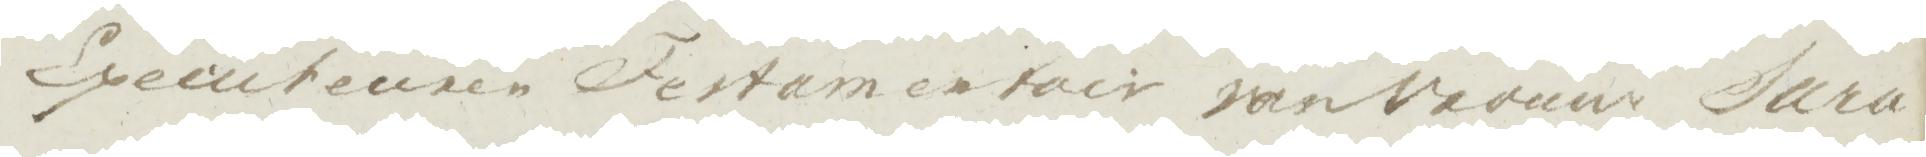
Executeuren Testamentair van vrouw Sara
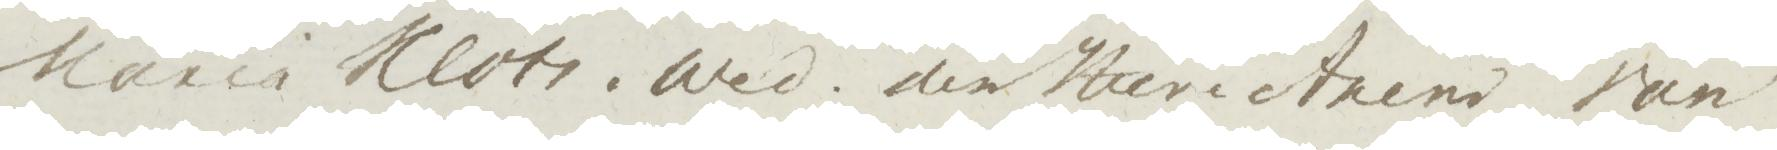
Maria Klots, wed. den Heere Arend van
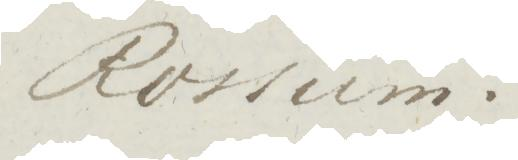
Rossum.
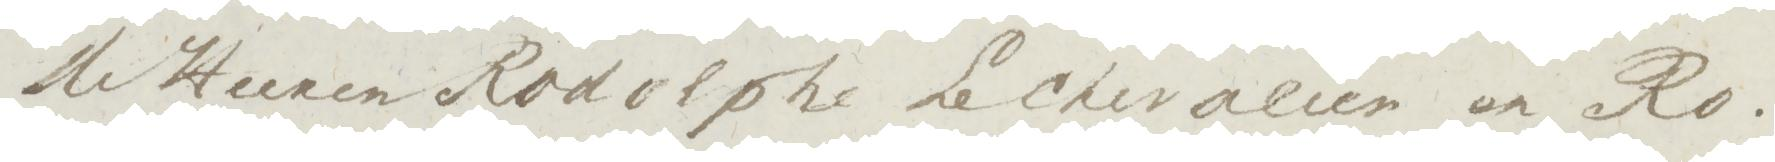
de Heeren Rodolphe Le Chevalier en Ro.
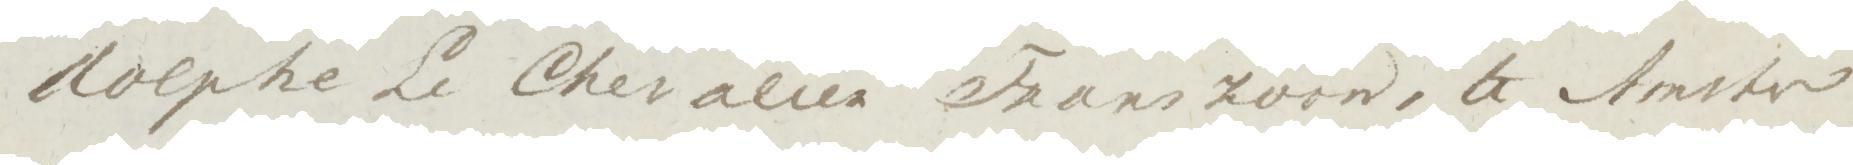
dolphe Le Chevalier Franszoon, te Amster
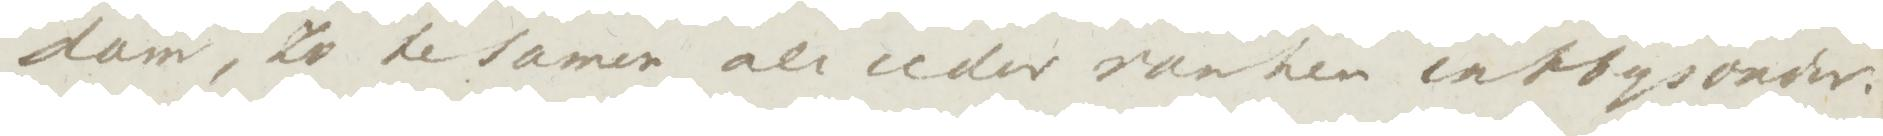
dam, zo te samen als ieder van hen in't bysonder.
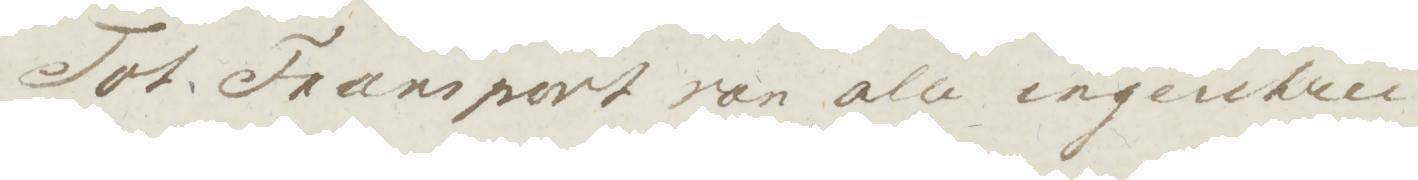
Tot Transport van alle ingeschree
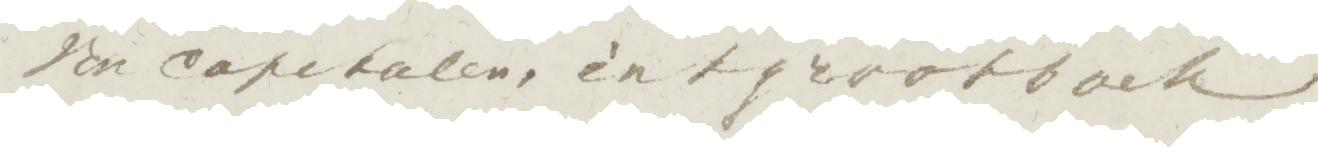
ven capitalen, in't grootboek.
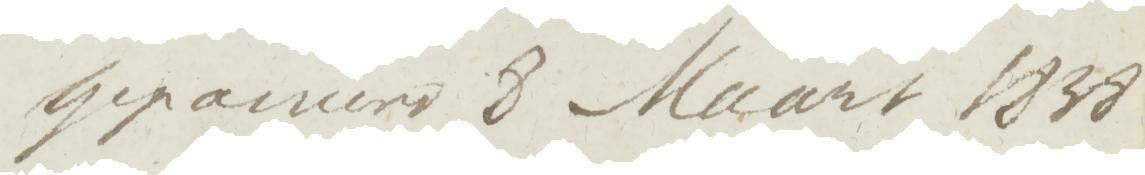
Gepaseerd 8 Maart 1838
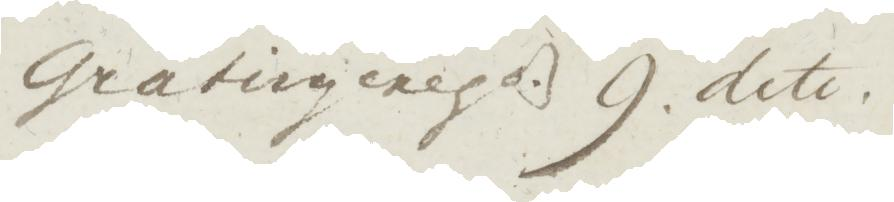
Gratis geregd. 9. dito.
